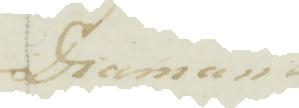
Diamant
